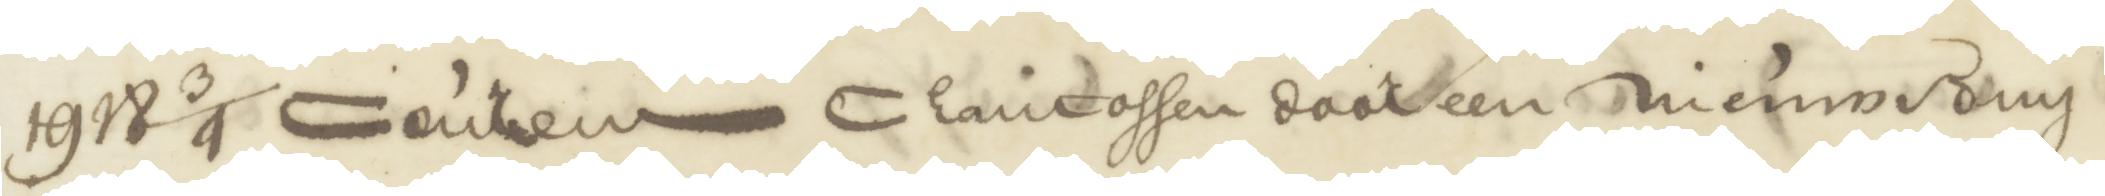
1918 ¾ Courene Chancossen door een nieuwe duy
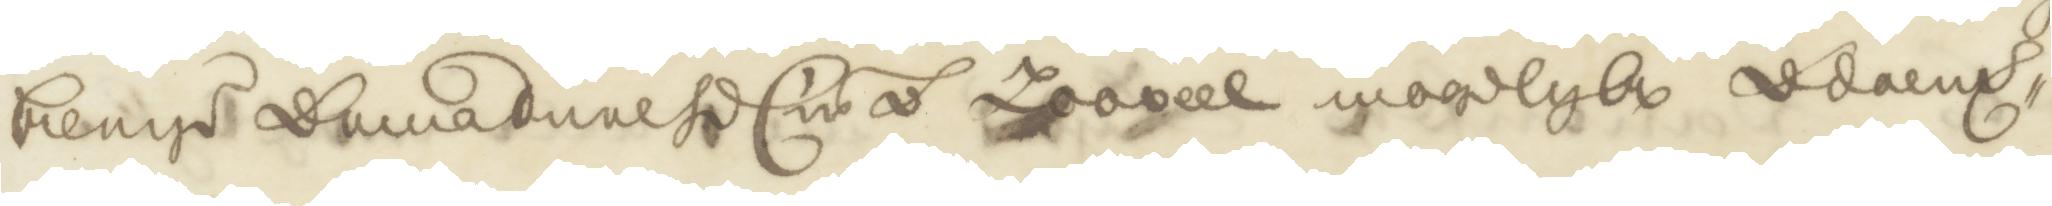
kerye ter madurese Custe Zooveel mogelyk te doen ver„
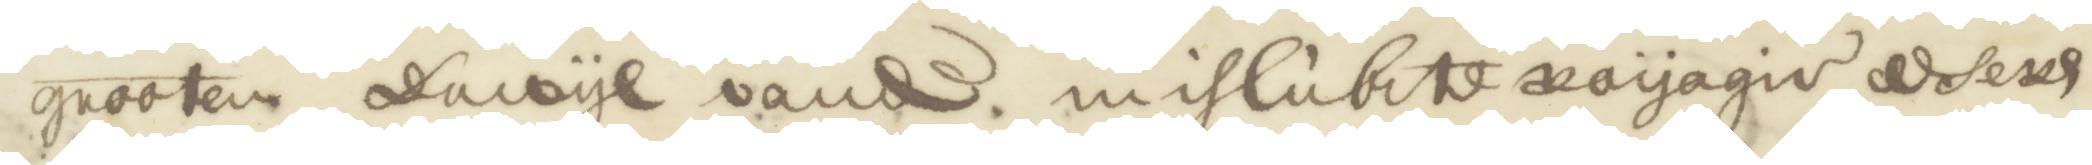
grooten terwijl vande. mislukte voijagie deseven
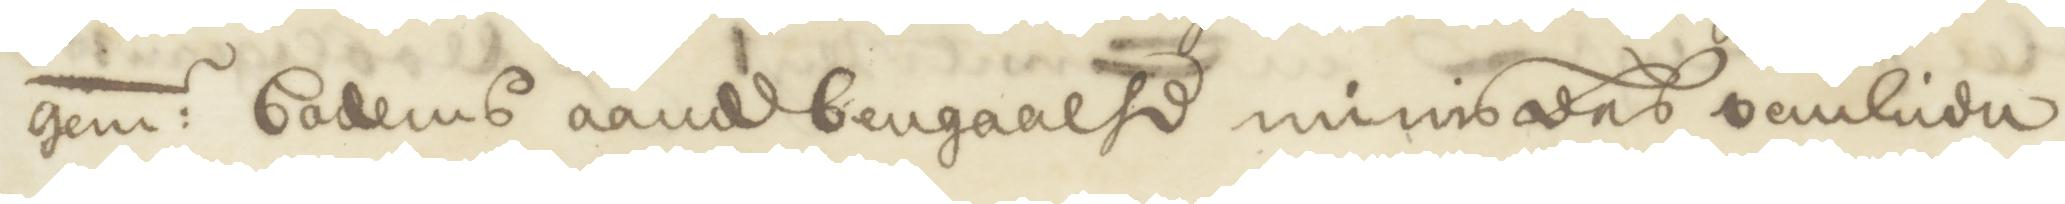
gem:s bodems aande bengaalse minsters van hier
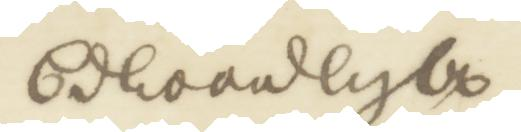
behoorelyk
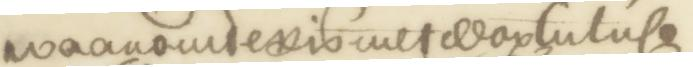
waarom de vis met de op tutuco
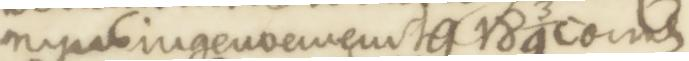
ryns ingenoemen 1918 ¾ couren
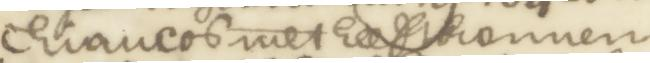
Chiancos niet hefkonnen
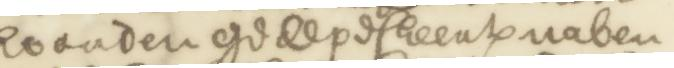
worden gedepecheert na ben
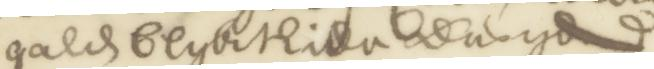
galen blykt hier ten syde
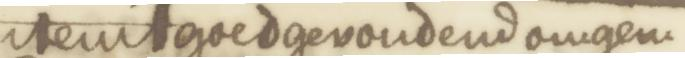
item't goed gevondene omgem.
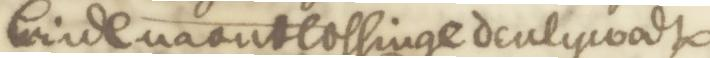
kiel na ontlossinge der lywaet
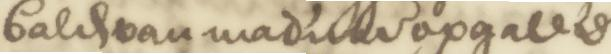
balen van madure op gale te
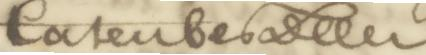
laten bestellen
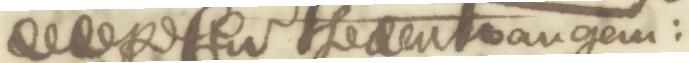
de depeche 'tsedert van gem:e
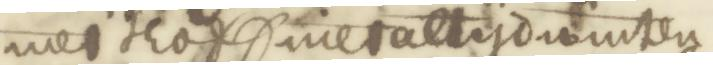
met' thoff niet altijd winter
